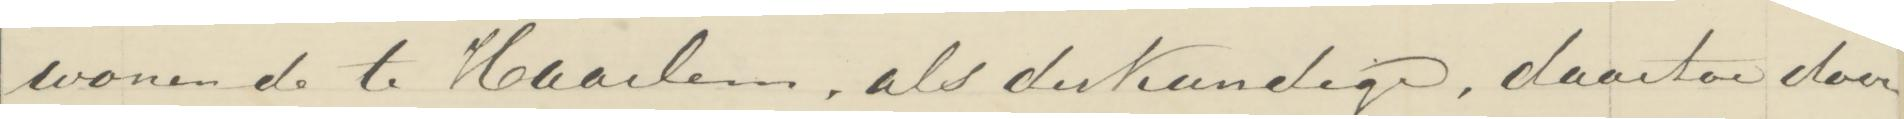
wonende te Haarlem, als deskundige, daartoe door
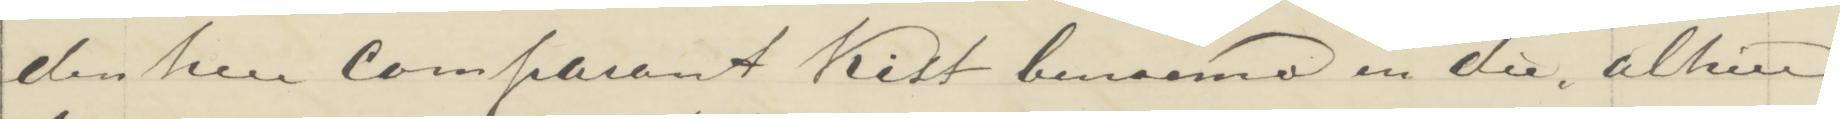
den heer comparant Kist benoemd en die, alhier
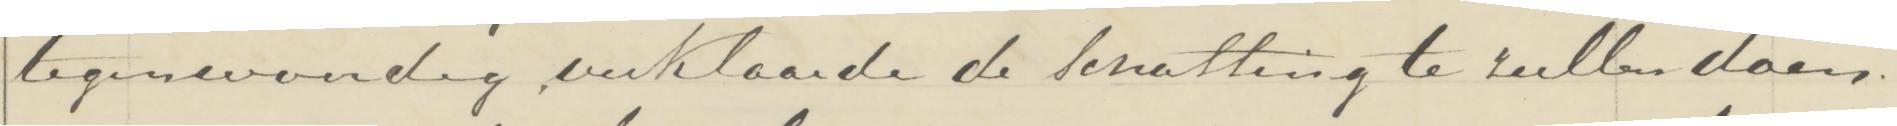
tegenwoordig, verklaarde de schatting te zullen doen.
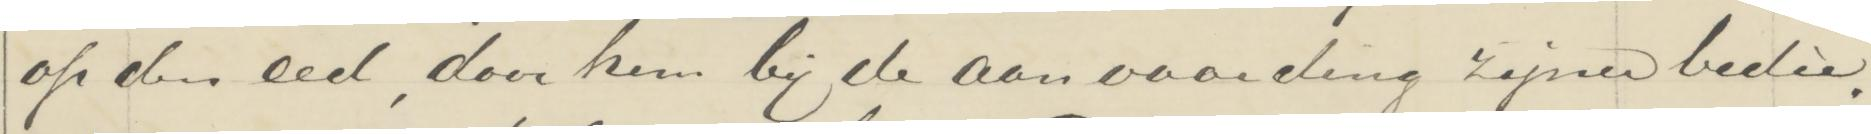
op den eed, door hem bij de aanvoording zijne bedie„
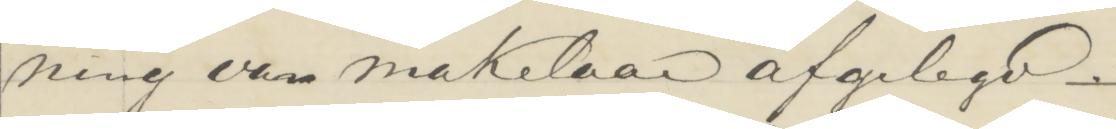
ning van makelaar afgelegd-.
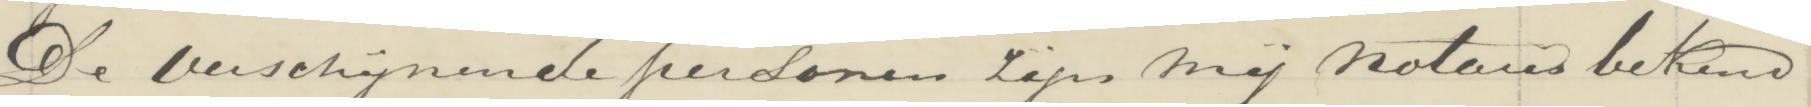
De verschijnende personen zijn mij notaris bekend
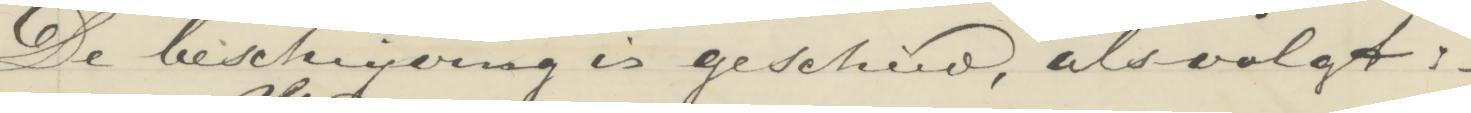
De beschrijving is geschied, als volgt:
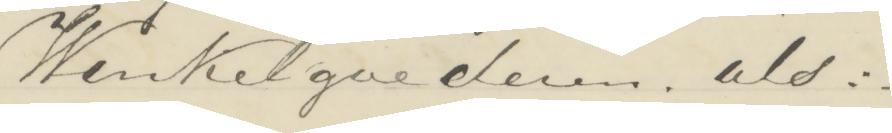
Winkel goederen. als:
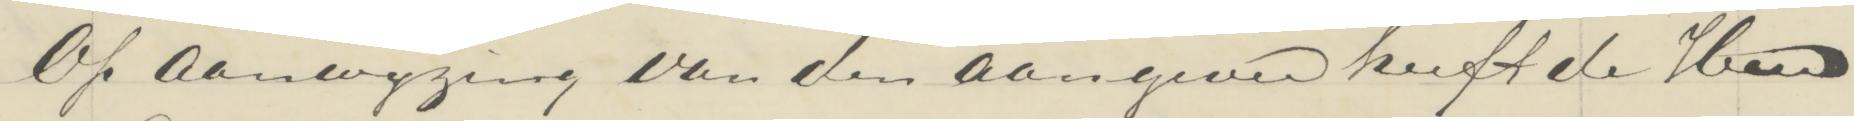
Op aanwyzing van den aangever heeft de Heer
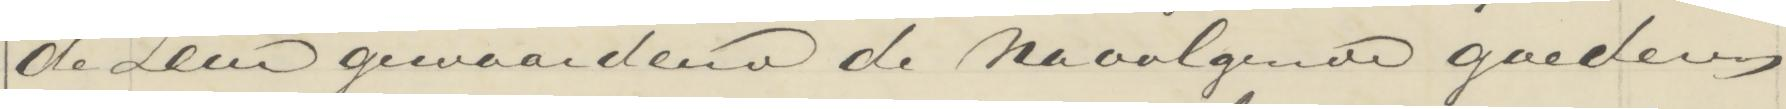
de Leur gewaardeerd de navolgende goederen
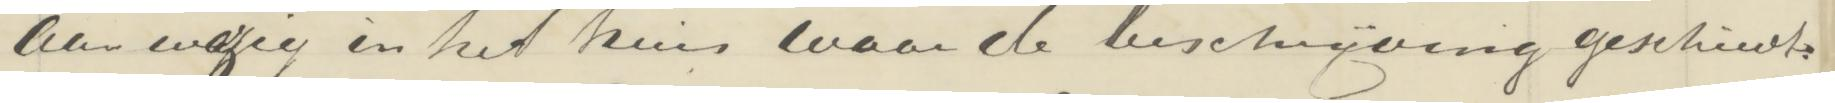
aanwezig in het huis waar de beschrijving geschiedt.
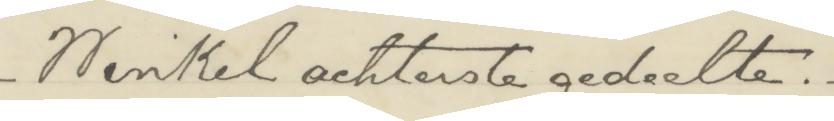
Winkel achterste gedeelte.
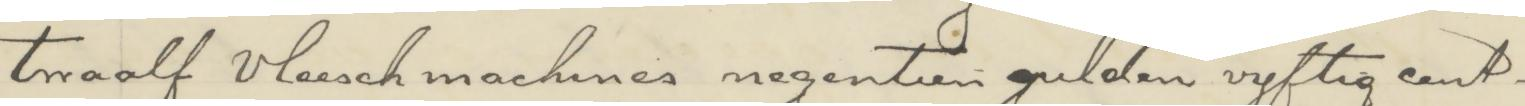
twaalf vleesch machines negentien gulden vyftig cent
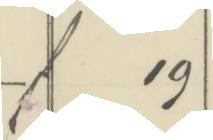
ƒ 19
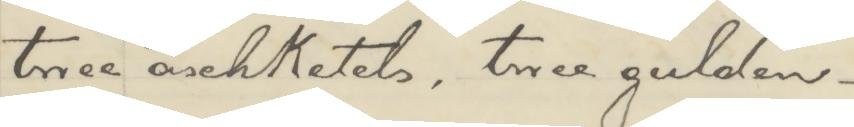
twee aschketels, twee gulden
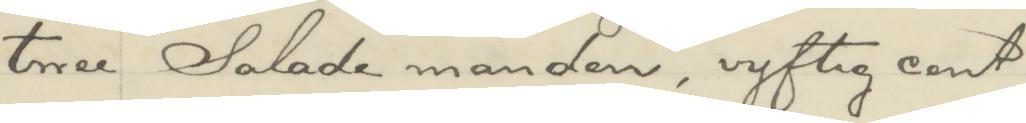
twee Salade manden, vyftig cent
